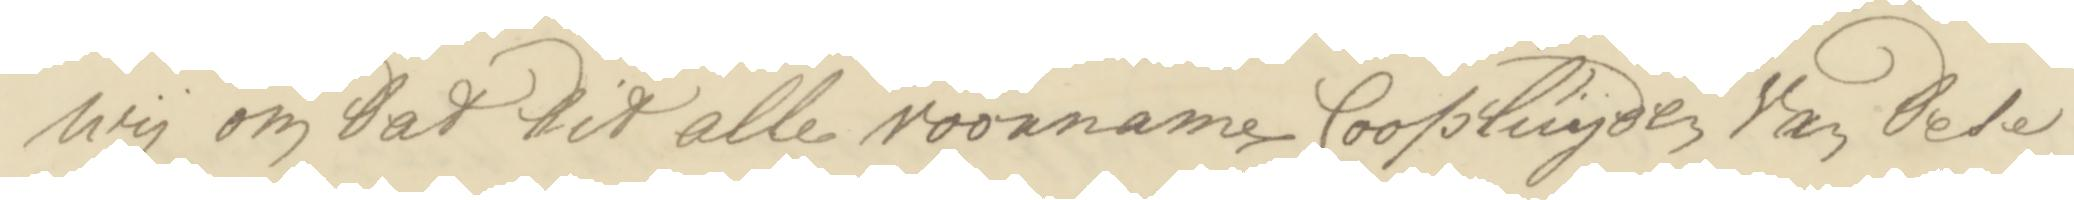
wij om dat dit alle voorname Coopluijden van dese
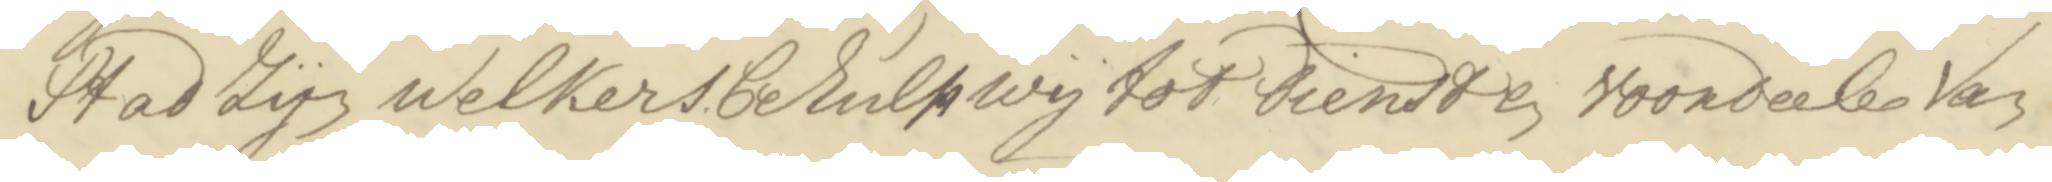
stad zijn welkers behulp wij tot dienst en voordeele van
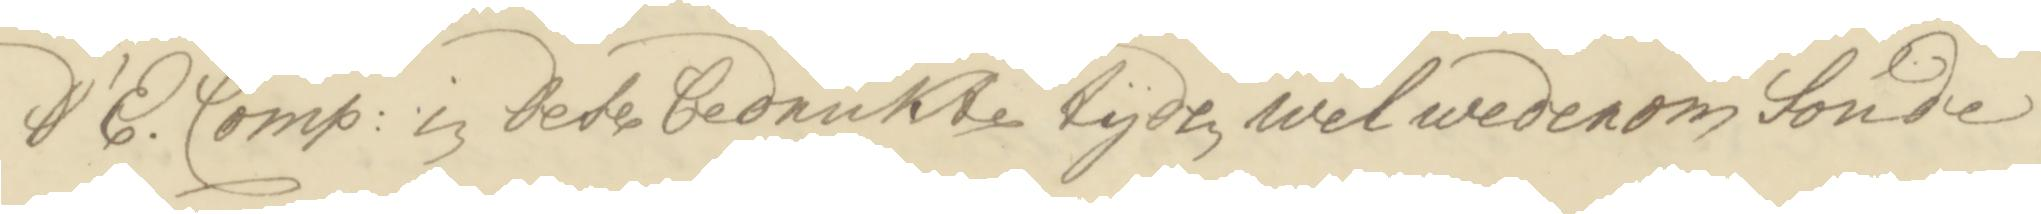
d’E. Comp: in dese bedrukte tijden wel wederom soude
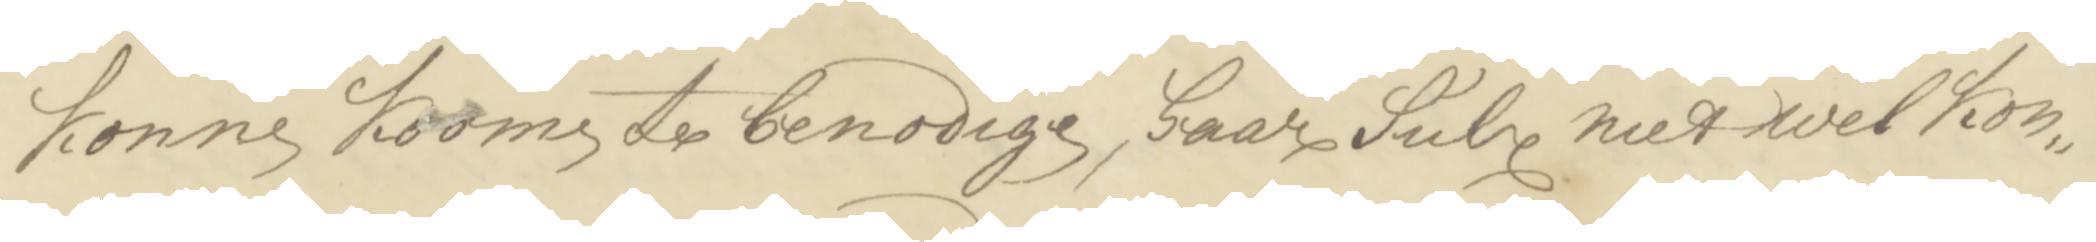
konnen koomen te benodigen, haar sulx niet wel kon„
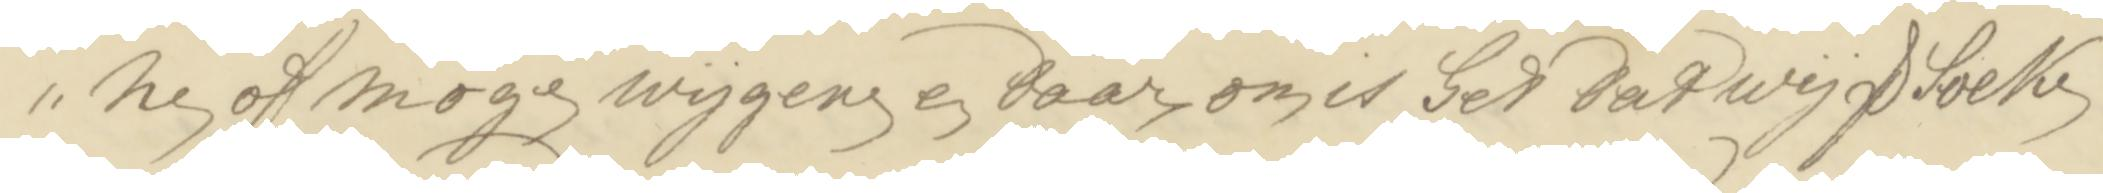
„nen of mogen wijgeren en daar om is het dat wij versoeken
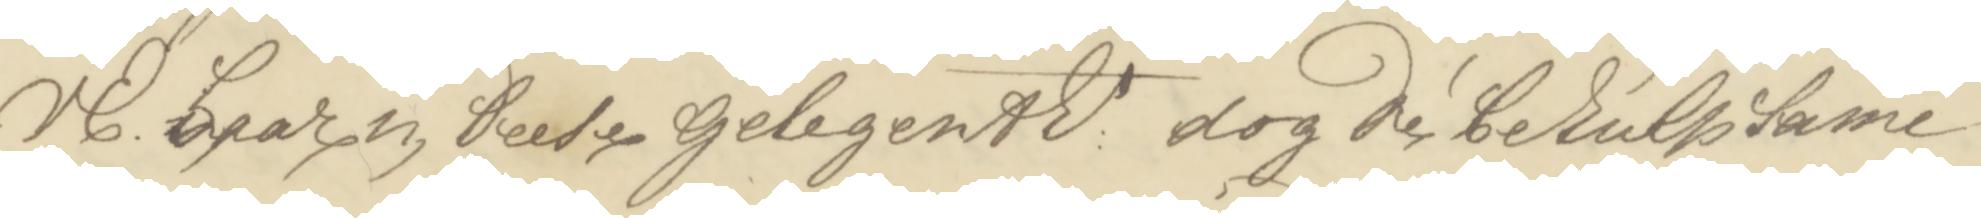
VE. haar in deese gelegenth:t dog de 'behulpsame
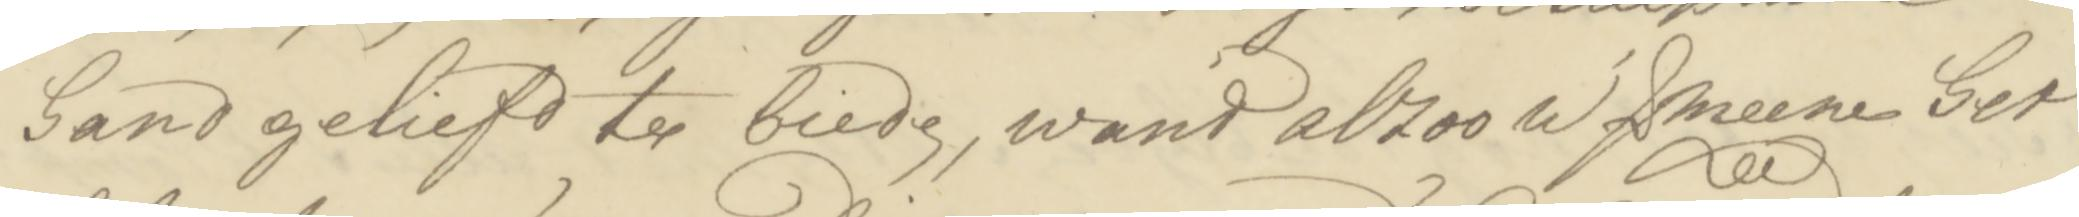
hand geliefd te bieden, want alzoo u vermeene het
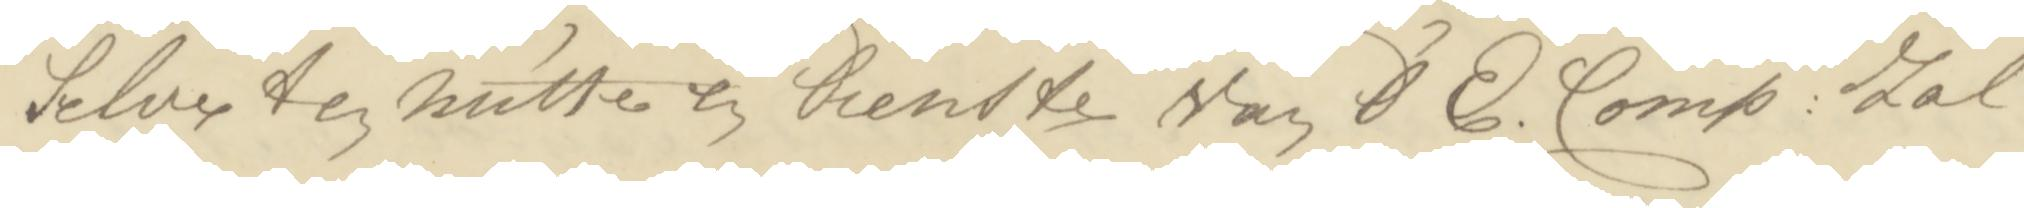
selve ten nutte en dienste van d' E. Comp: zal
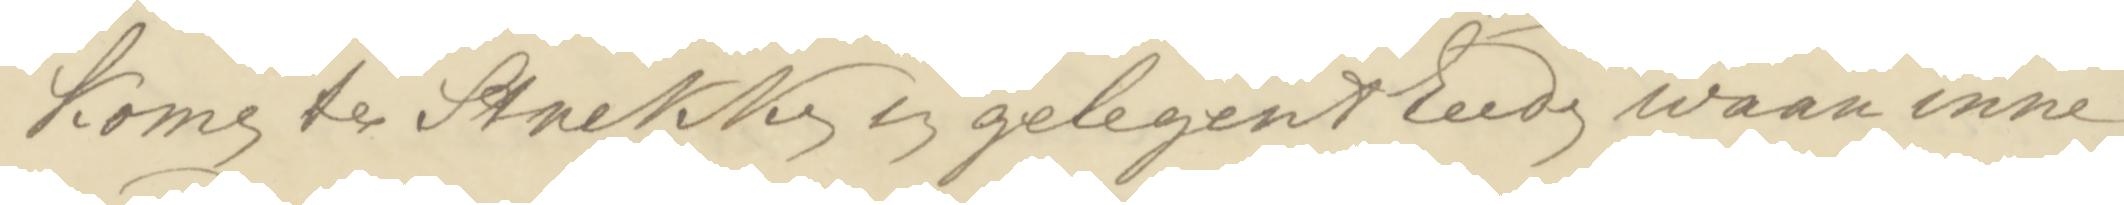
komen te strekken in gelegentheeden waar inne
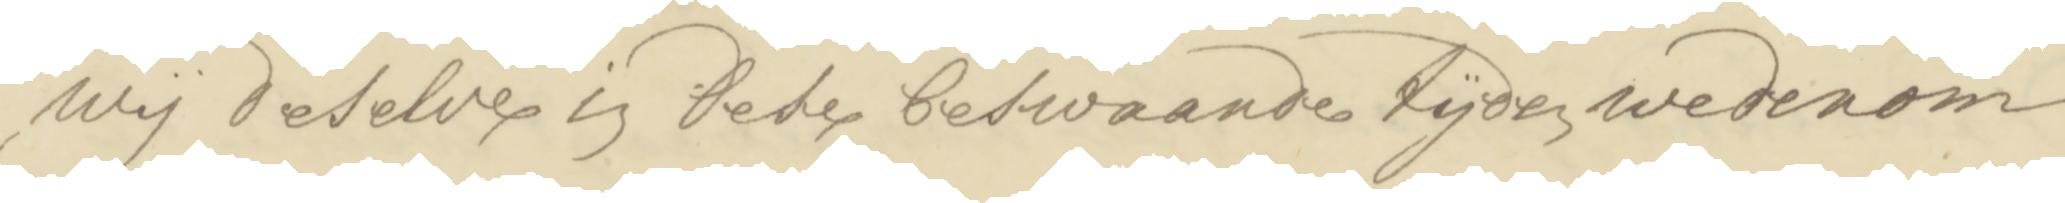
wij deselve in dese beswaarde tijden wederom
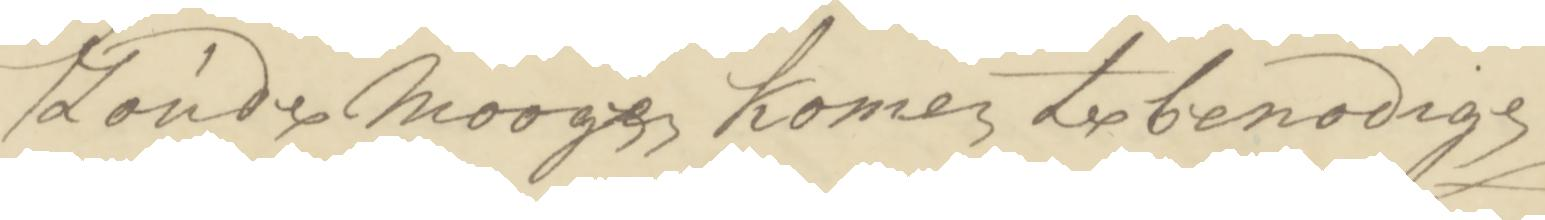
zoude moogen komen te benodigen
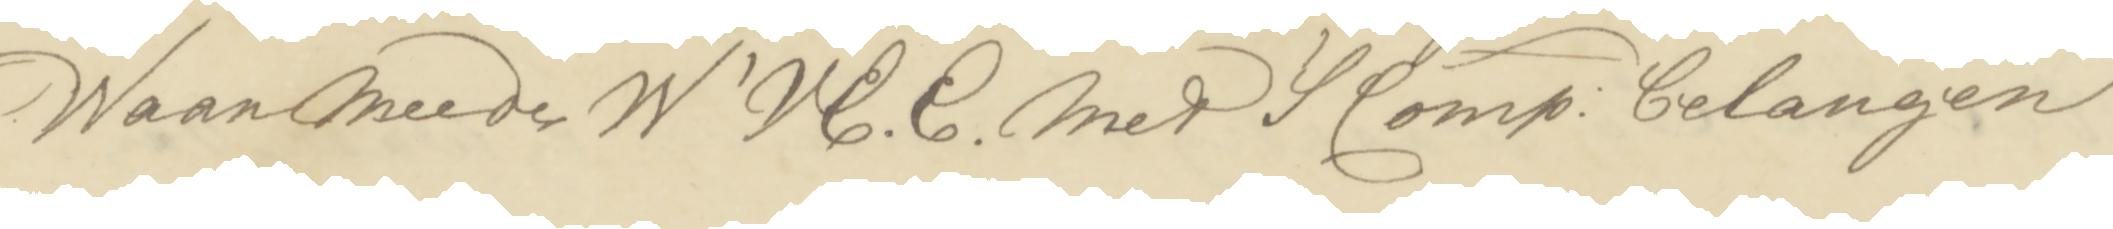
Waar meede W' VE. E. met ’s Comp: belangen
